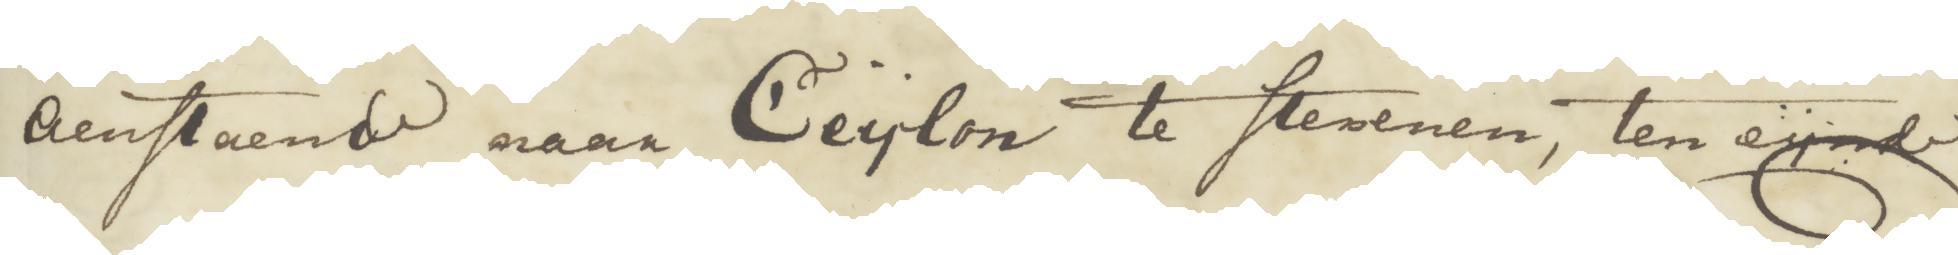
aenstaende naar Ceijlon te stevenen, ten eijnde
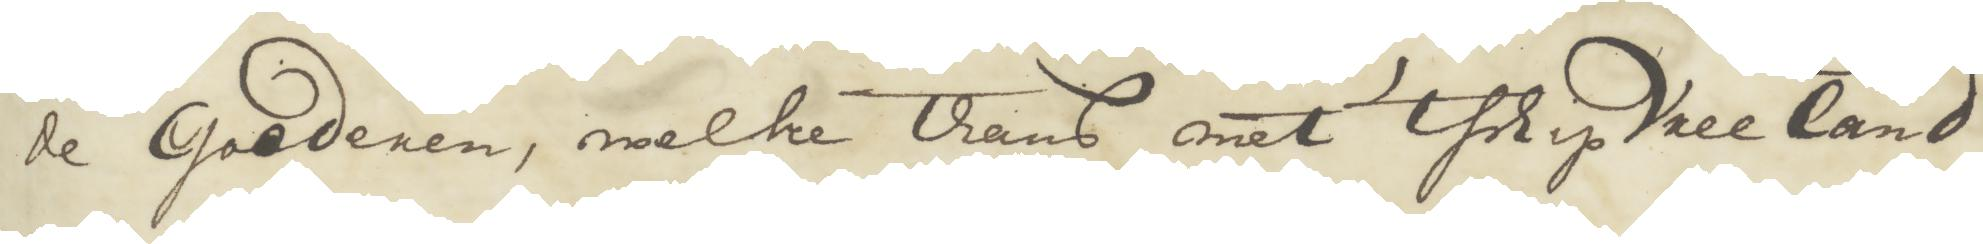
de Goederen, welke thans met ’t schip Vreeland
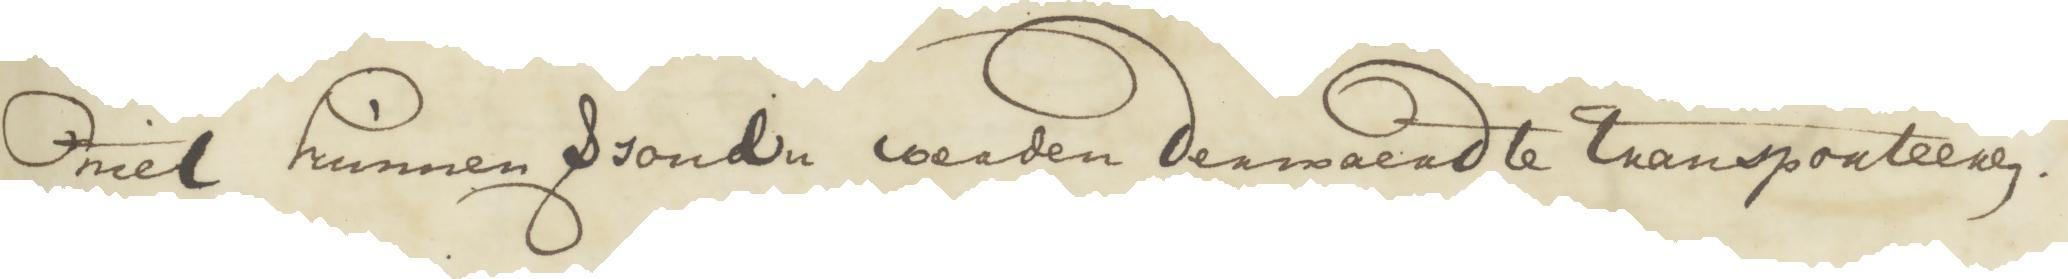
niet hunnen versonden werden derwaerd te transporteeren.
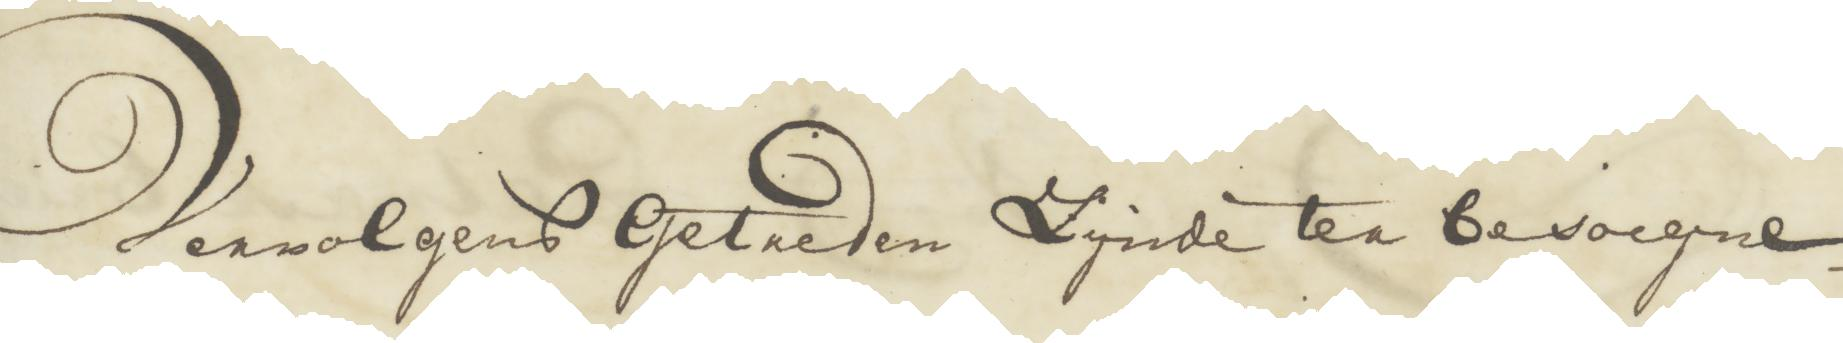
Vervolgens getreden zijnde ter besoigne
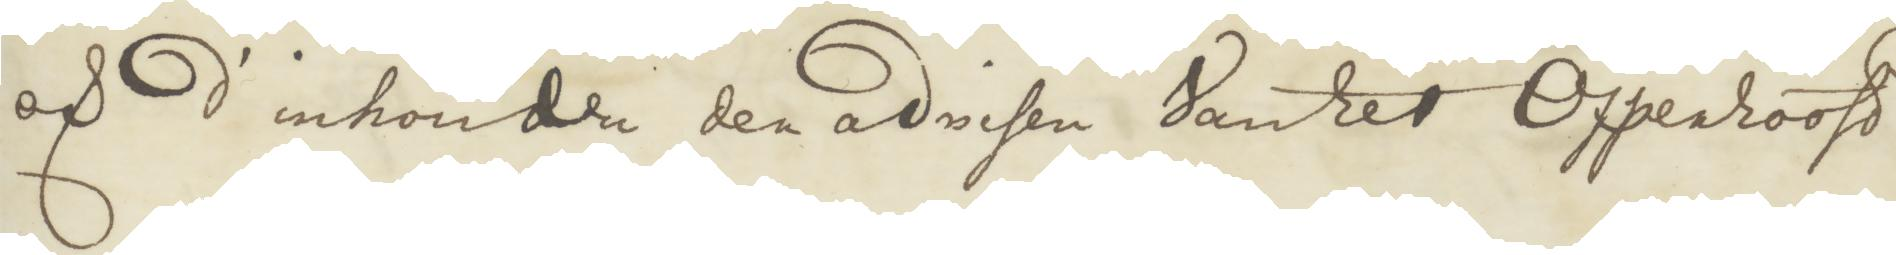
over d’ inhouden der advisen van het Opperhoofd
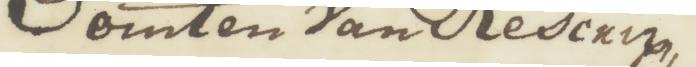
Pointen van Rescrip„
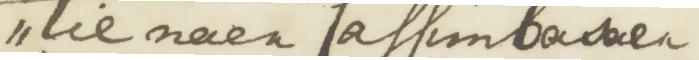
„tie naer Cassimbasaer
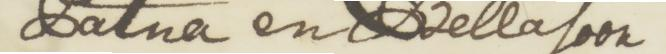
Patna en Bellasoor
